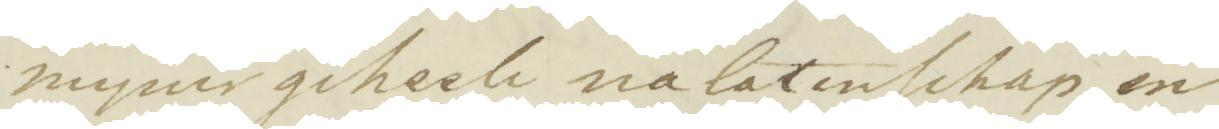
myner geheele nalatenschap, en
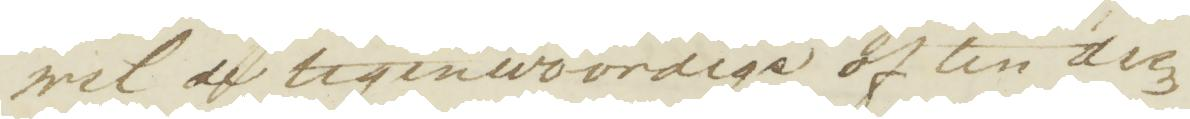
wel de tegenwoordige of ten dien
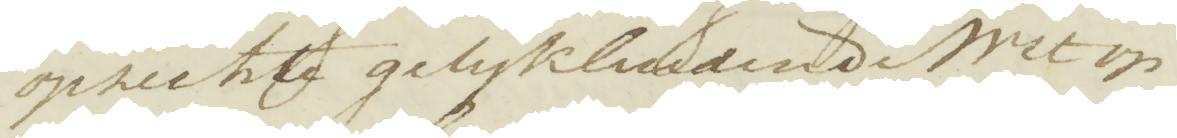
oprechte gelykluidende Wet op
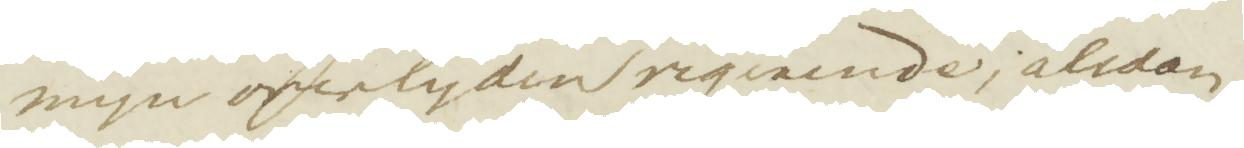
myn overlyden vigerende, alsdan
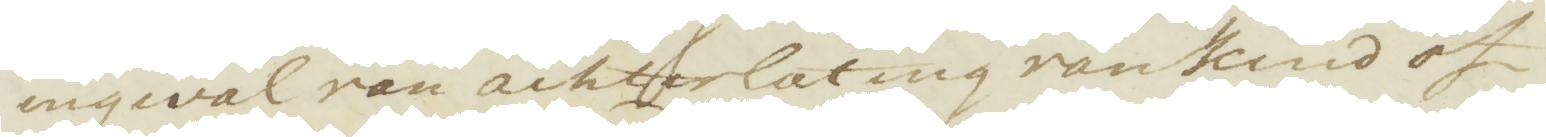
ingeval van achterlating van kind of
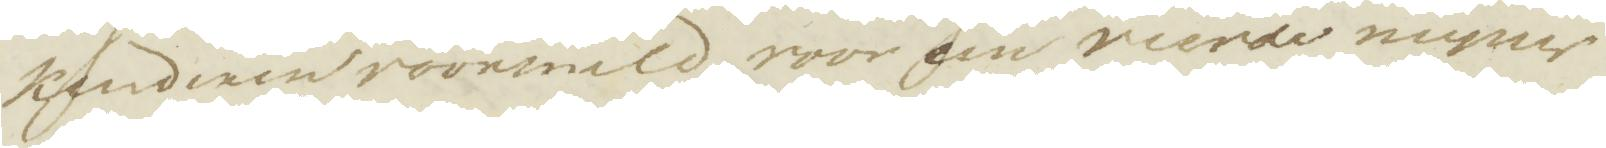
kinderen voormeld, voor een vierde myner
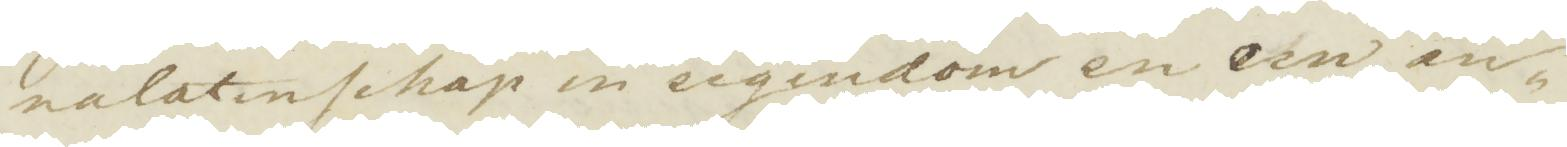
nalatenschap in eigendom en een an„
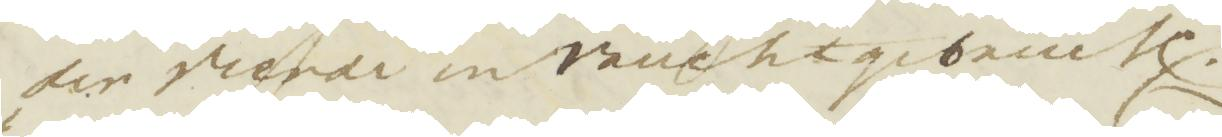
„der vierde in vruchtgebruik.
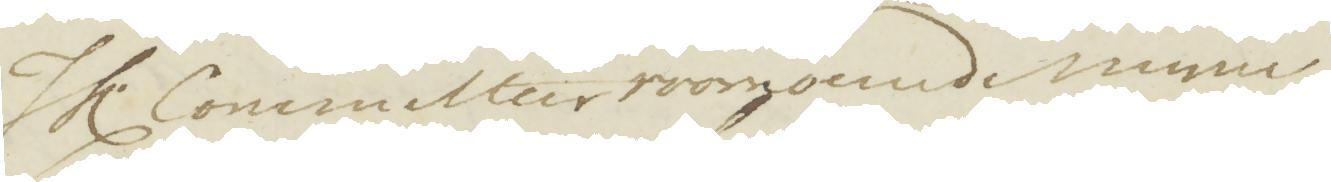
Ik Committeer voornoemde myne
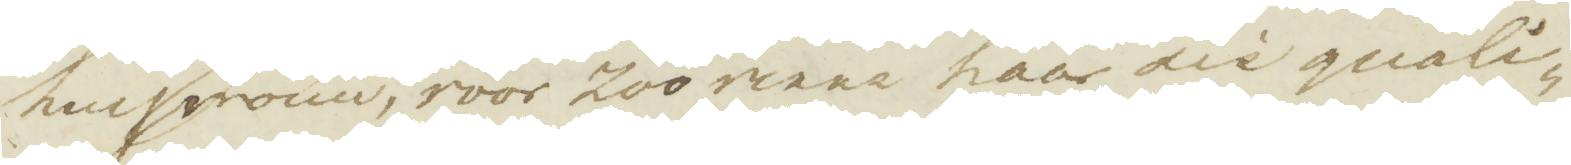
huisvrouw, voor zoo verre haar die quali„
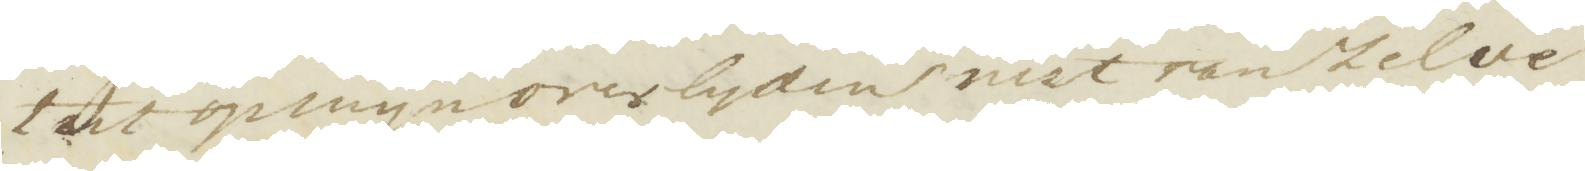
teit opmyn overlyden niet vanzelve
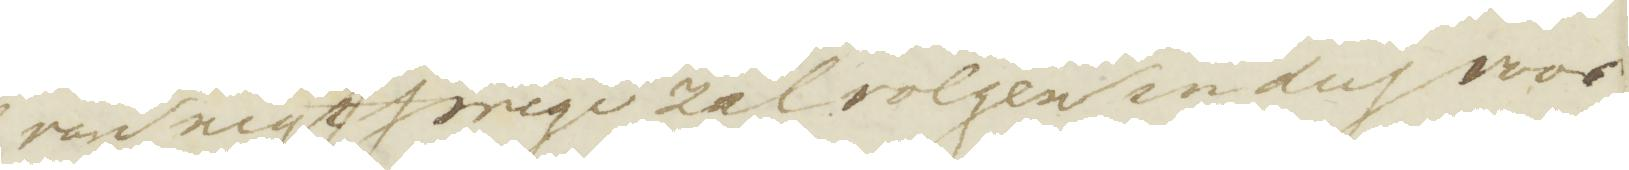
van regtswege zal volgen en dus voor
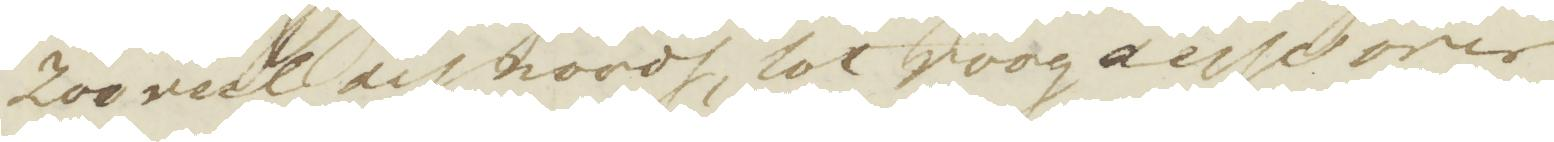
zoo veel desnoods, tot voogdesse over
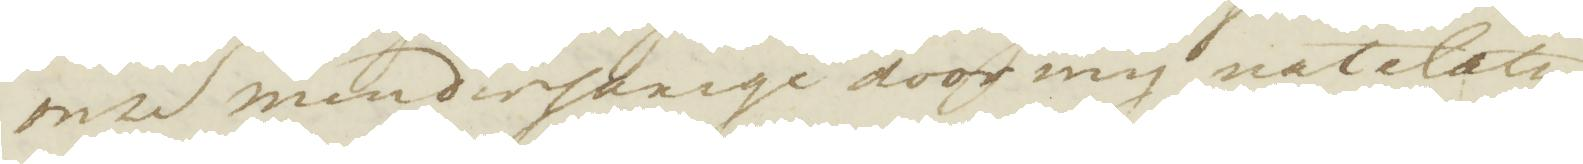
onze minderjarige door my natelaten
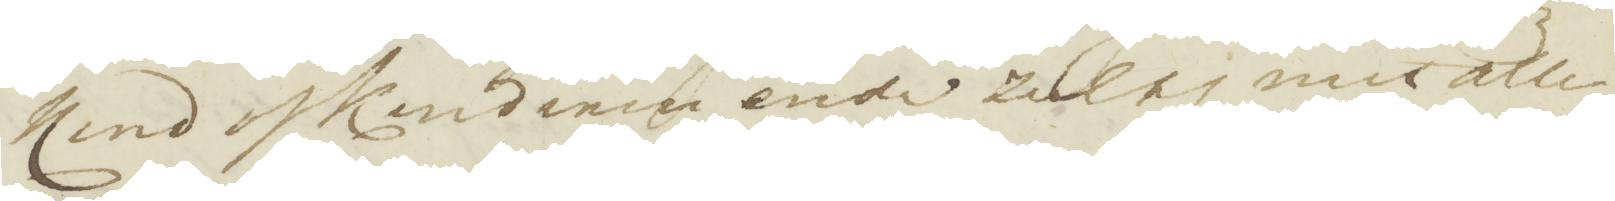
Kind of Kinderen ende zulks met alle
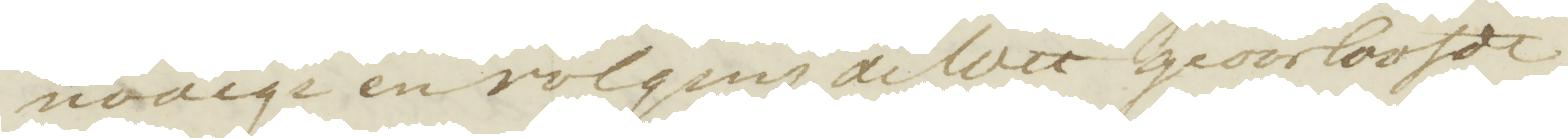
nodige en volgens de wet geoorloofde
